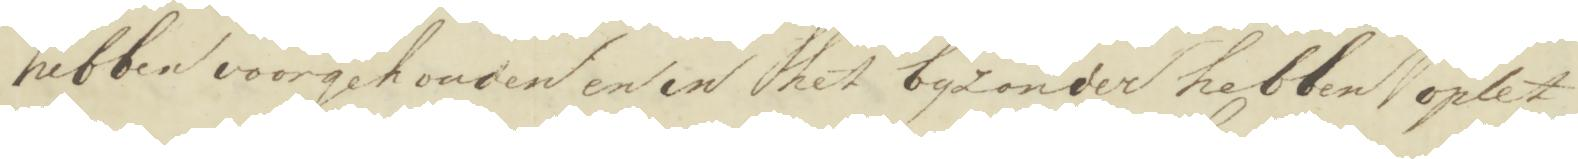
hebben voorgehouden en in het bijzonder hebben oplet
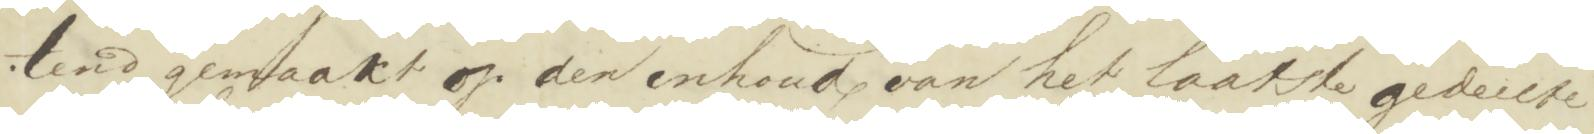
.tend gemaakt op den inhoud van het laatste gedeelte
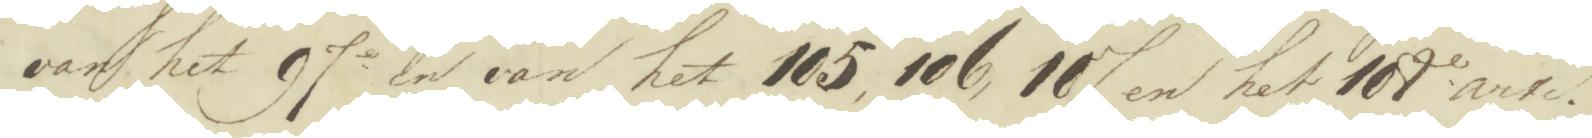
van het 97:e en van het 105, 106, 107 en het 108.e arti,
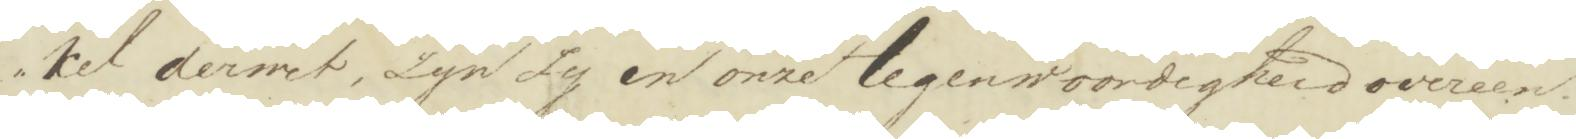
„kel der wet, zyn zy in onze tegenwoordigheid overeen
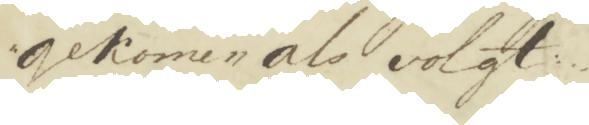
„gekomen als volgt:
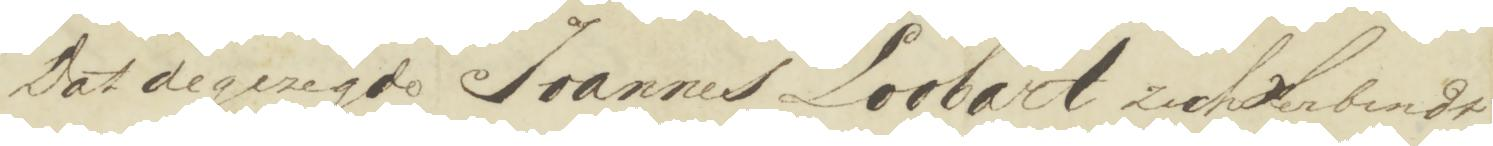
Dat de gezegde Ioannes Loobart zich verbindt
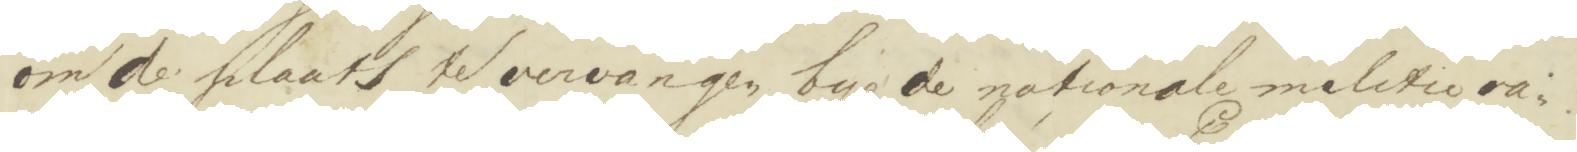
om de plaats te vervangen by de nationale militie van
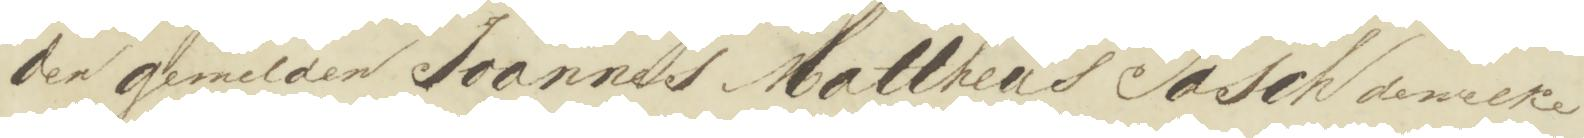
den gemelden Ioannes Mattheus Pasch dewelke
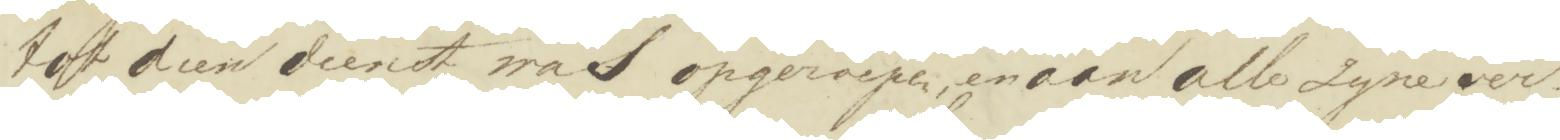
tot dien dienst was opgeroepen, en aan alle zyne ver
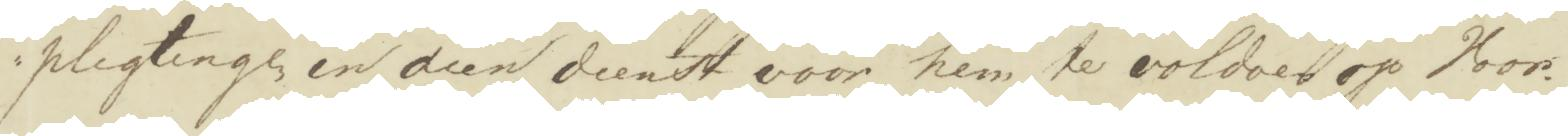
„pligtingen en dien dienst voor hem te voldoen op Voor.
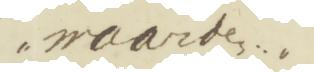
„waarden:„
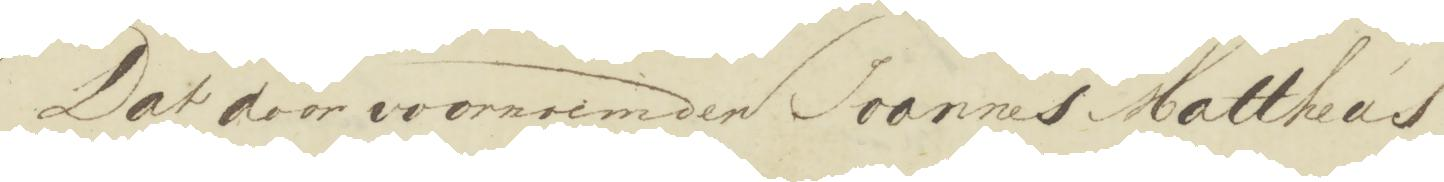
Dat door voornoemden Ioannes Mattheus
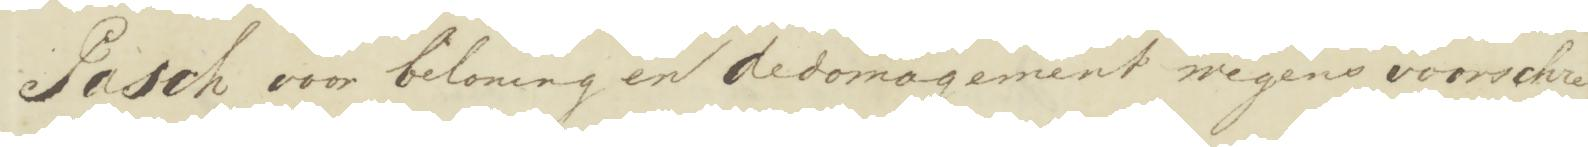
Pasch voor beloning en dedomagement wegens voorschre
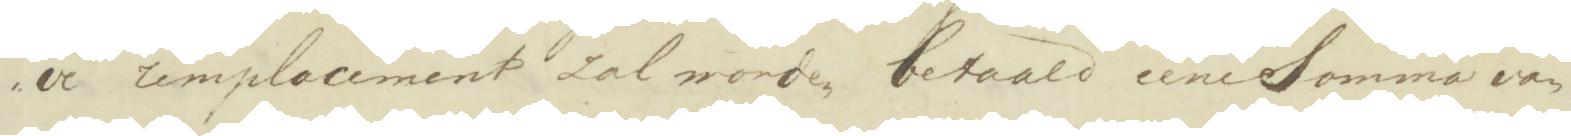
„ve remplacement zal worden betaald eene Somma van
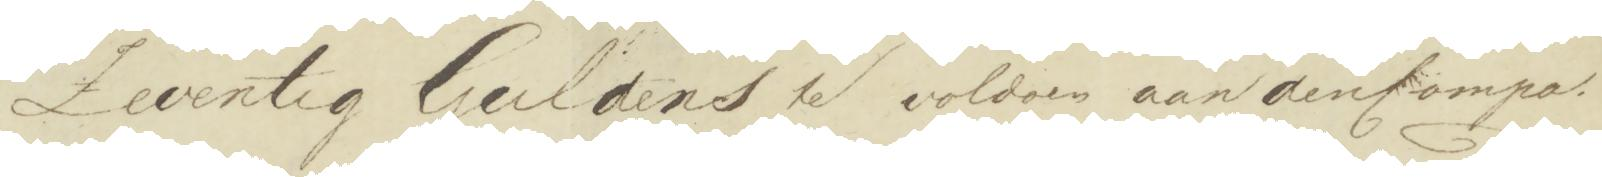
Zeventig Guldens te voldoen aan den Compa„
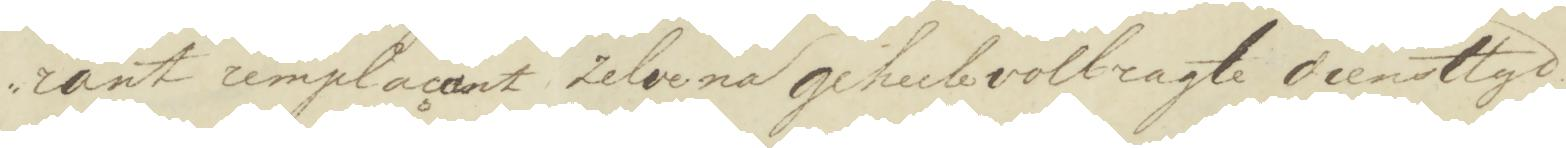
„rant remplaçant, zelve na geheele volbragte diensttyd.
